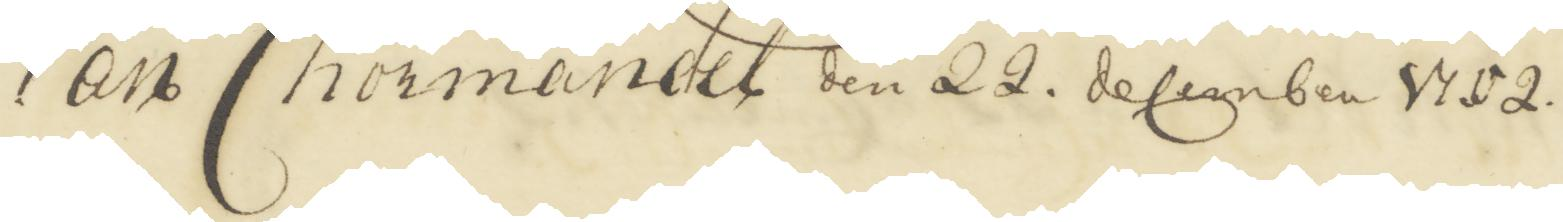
Van Chormandel den 22. december 1752.
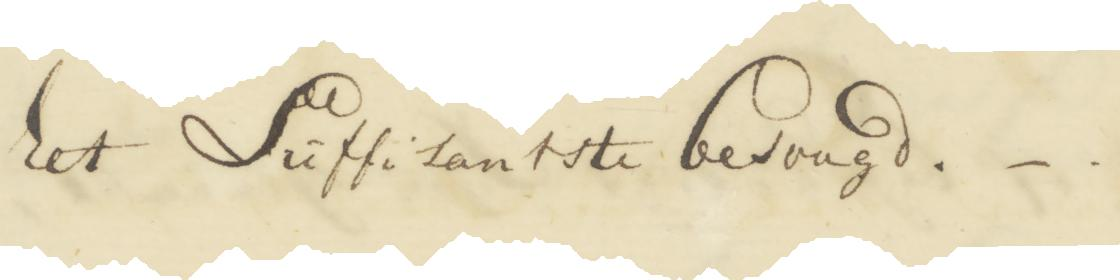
het Suffisantste besorgd. —.
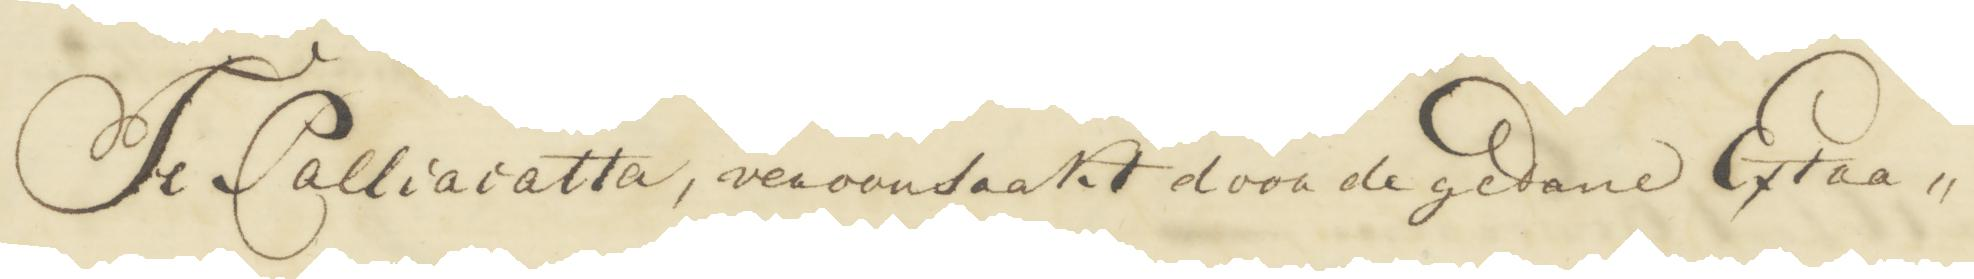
Te Palliacatta, veroorsaakt door de gedane Extra„
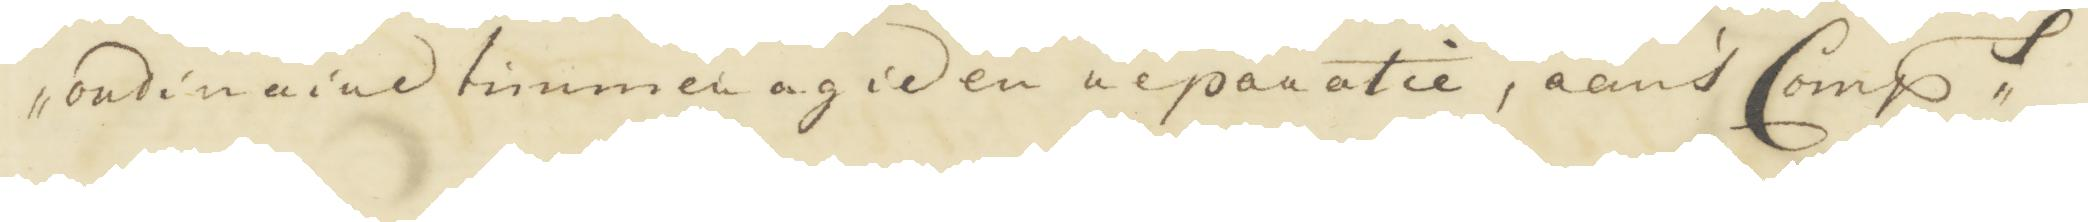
„ordinaire timmeragie en reparatie, aan ’s Comp„s
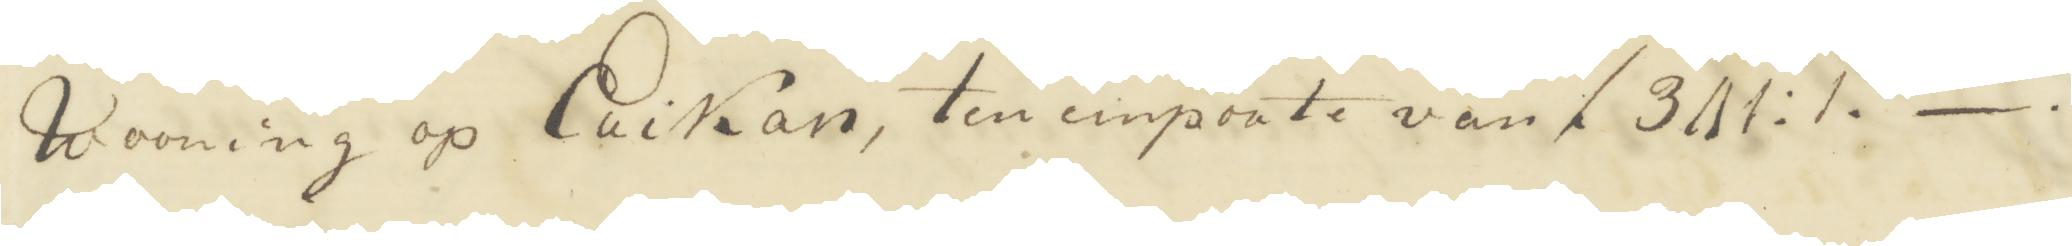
wooning op Erikan, ten emporte van ƒ 341: 1. —.
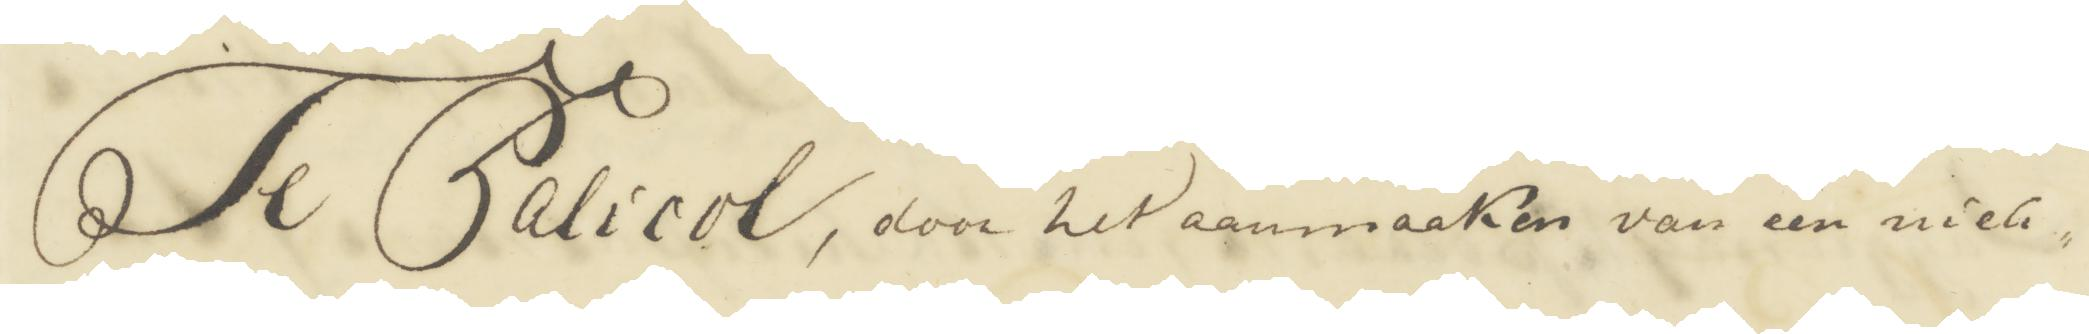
Te Palicol, door het aanmaaken van een nieu„
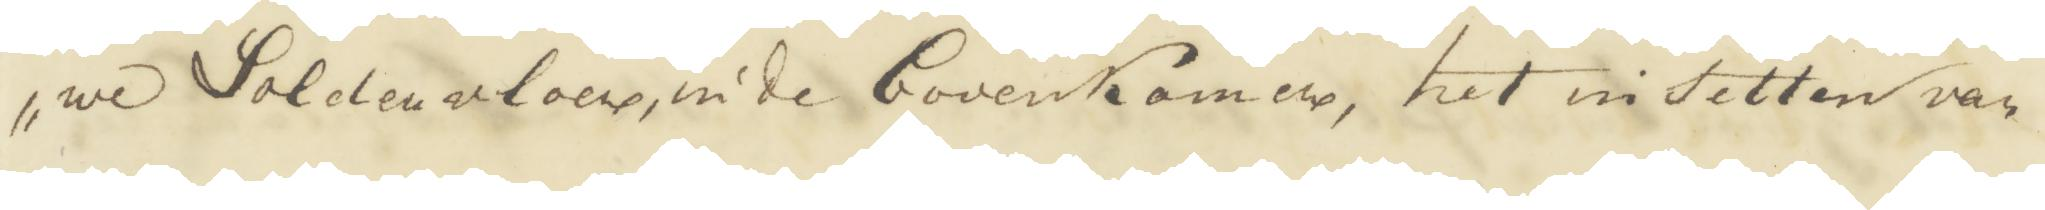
„we soldenvloer, in de bovenkamer, het insetten van
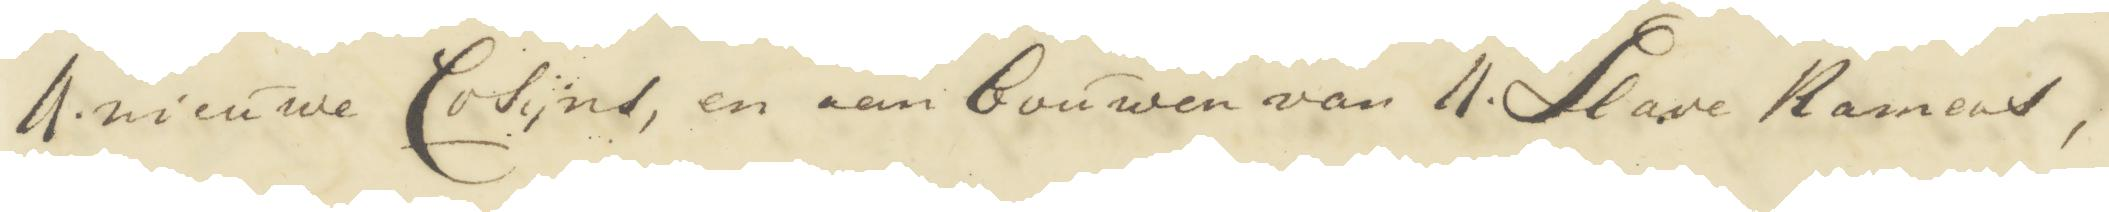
4. nieuwe Cosijns, en aan bouwen van 4. slave kamers,
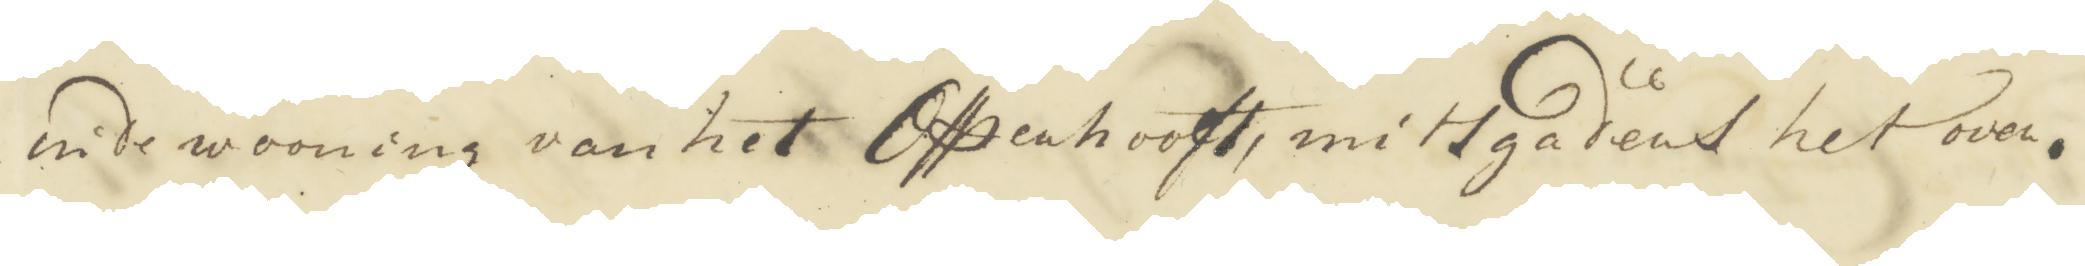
in de wooning van het Opperhooft, mitsgaders het over„
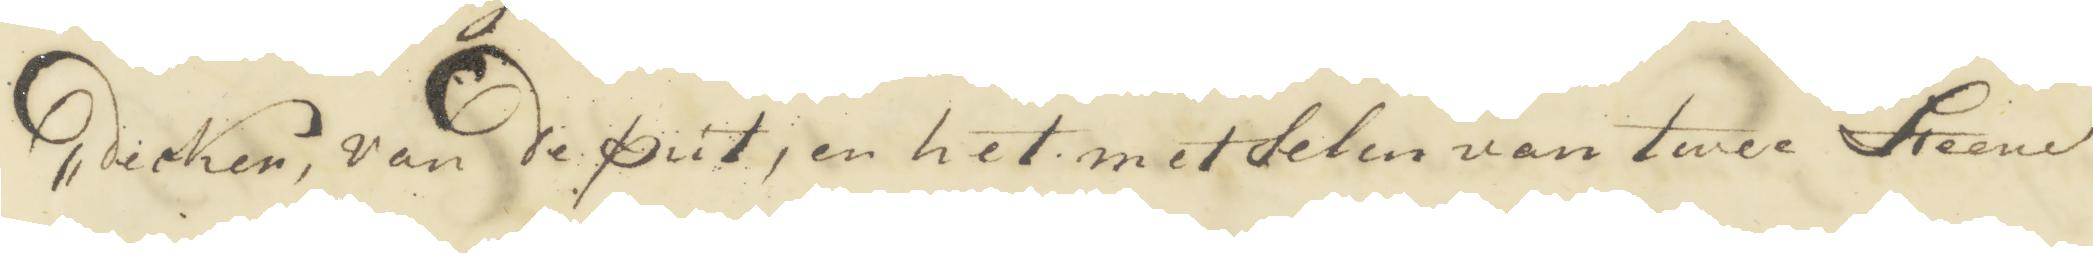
„decken, van de put, en het metselen van twee steene
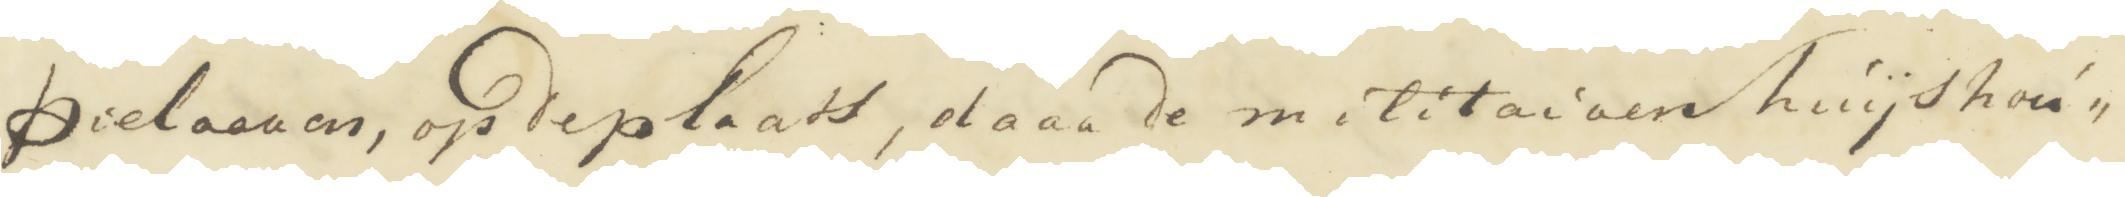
pielaaren, op de plaats, daar de militairen huijshou„
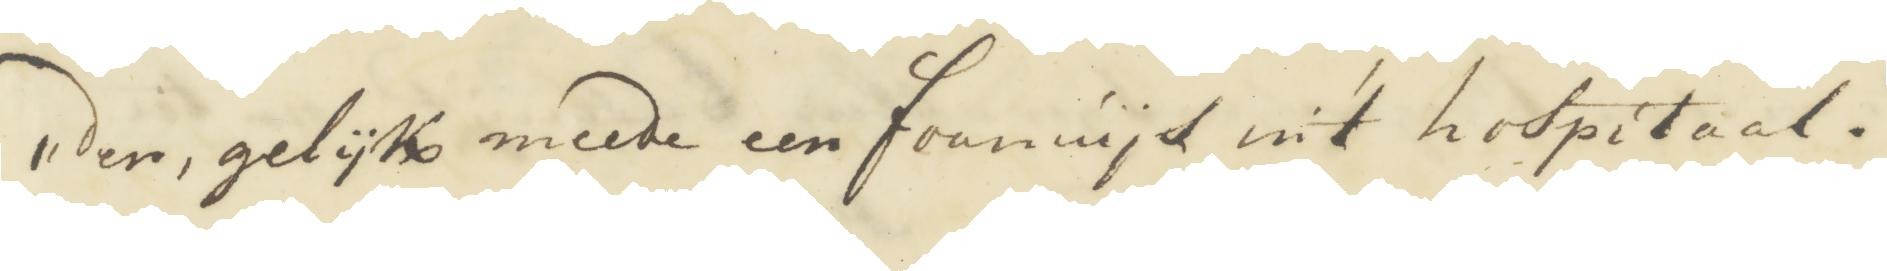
„den, gelijk meede een fornuijs in’t hospitaal.
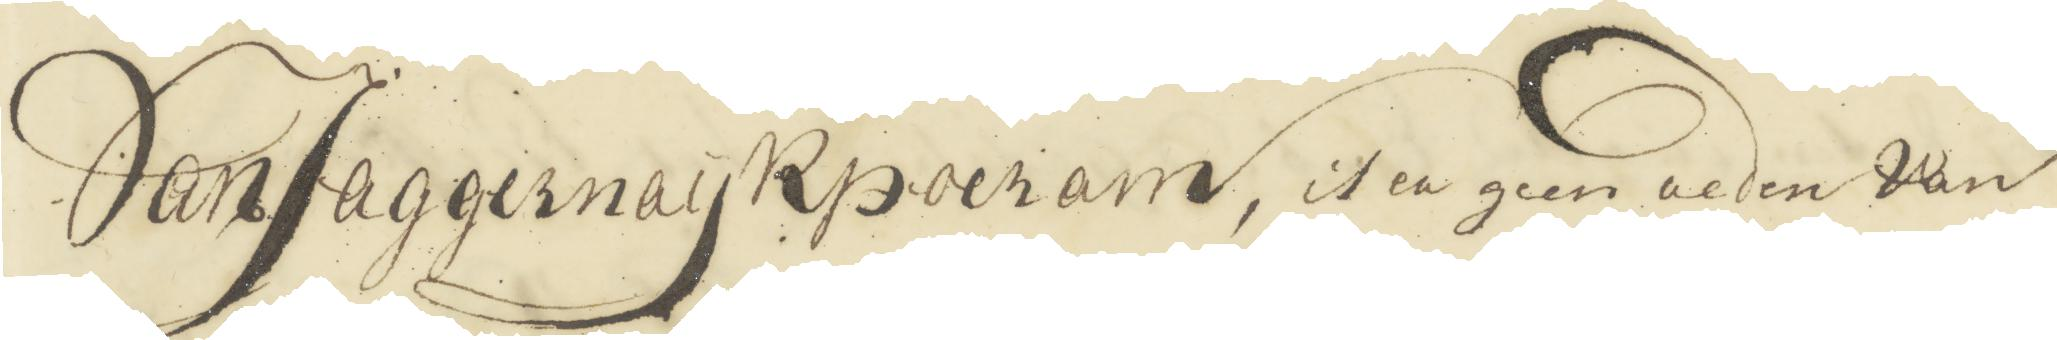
Van Jaggernaijkpoeram, is er geen reden van
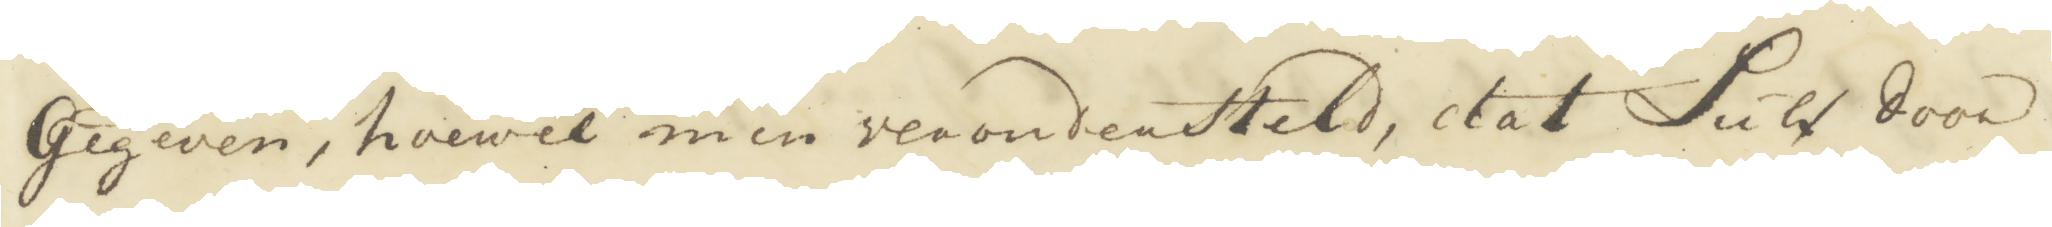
Gegeven, hoewel men verondersteld, dat sulx door
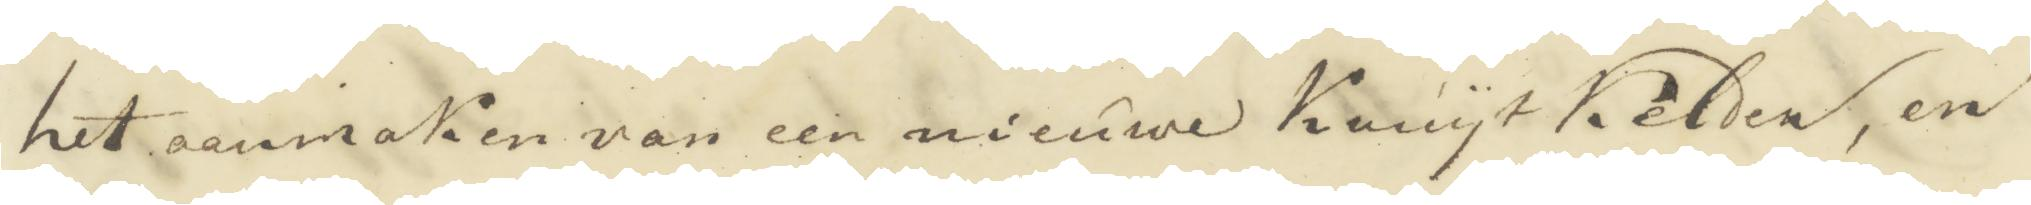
het aanmaken van een nieuwe kruijt kelder, en
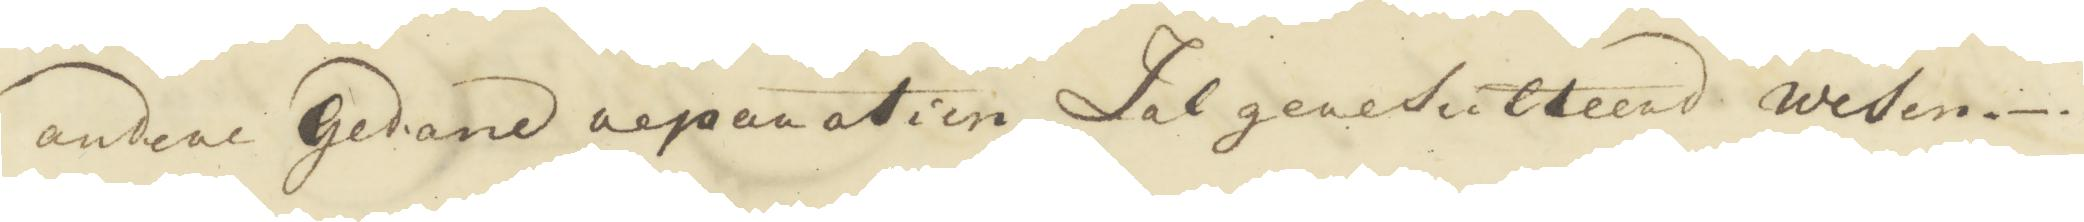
andere gedane reparatien, zal geresulteerd wesen.—.
